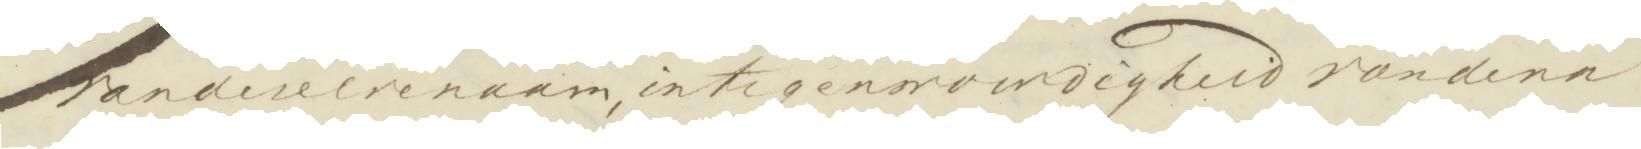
van dezelve naam, in tegenwoordigheid van denn
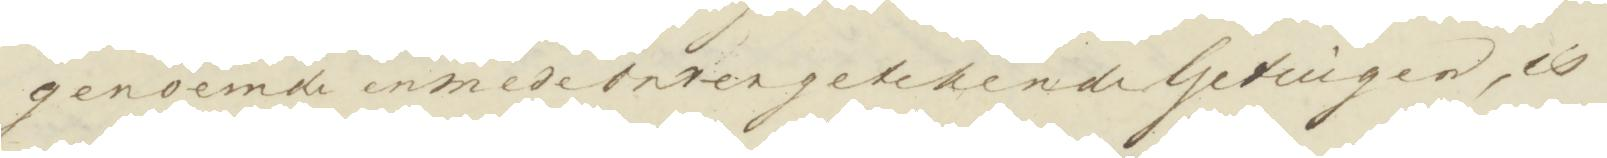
genoemde en mede ondergetekende Getuigen, is
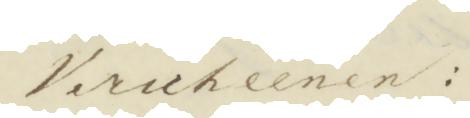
Verscheenen:
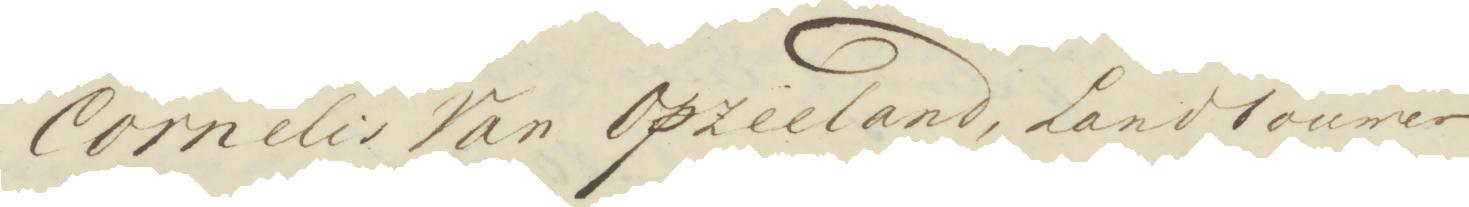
Cornelis van opzeeland, Landbouwer
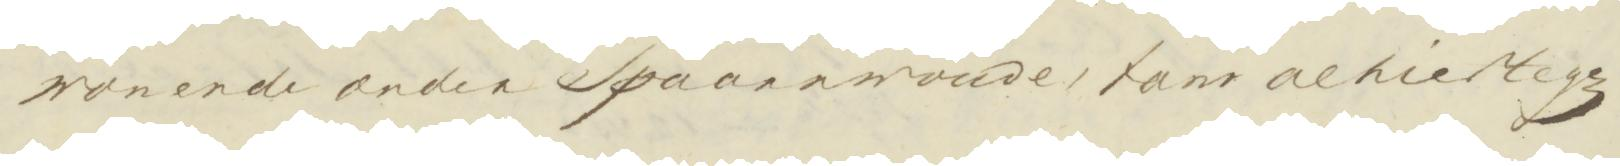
wonende onder spaarnwoude, tans alhier tegen
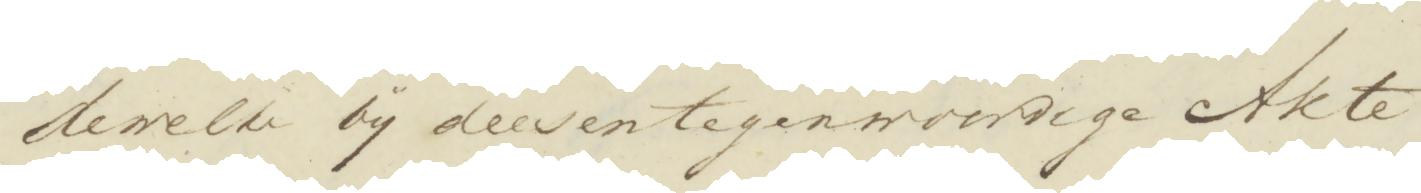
dewelke by deesen tegenwoordige Akte
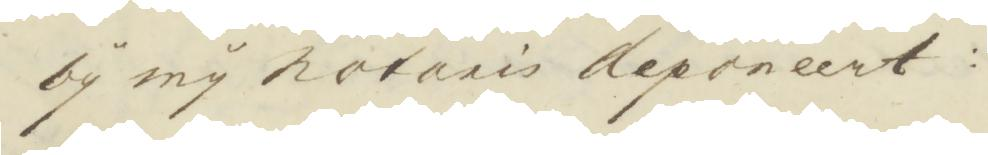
bij mij notaris deponeert.
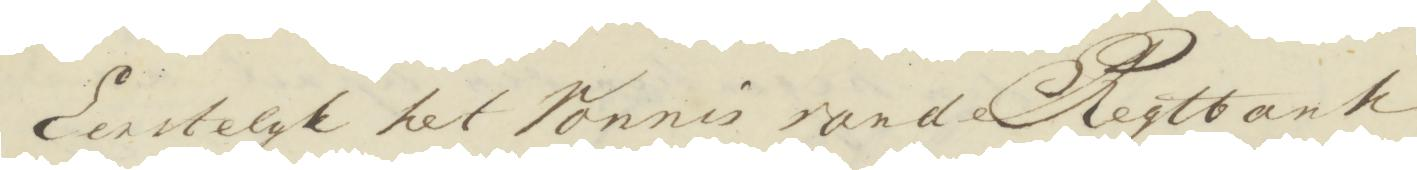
Eerstelyk het Vonnis van de Regtbank
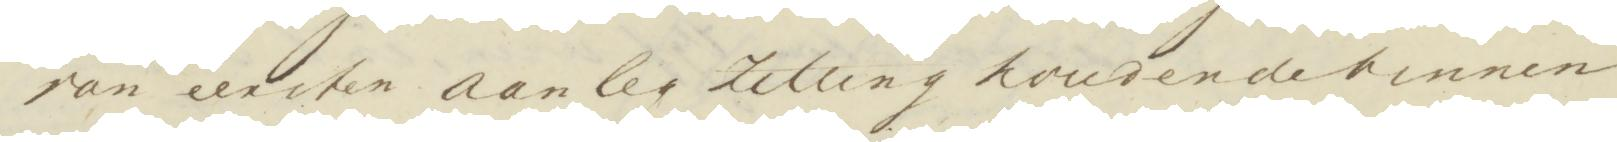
van eersten aanleg zitting houdende binnen
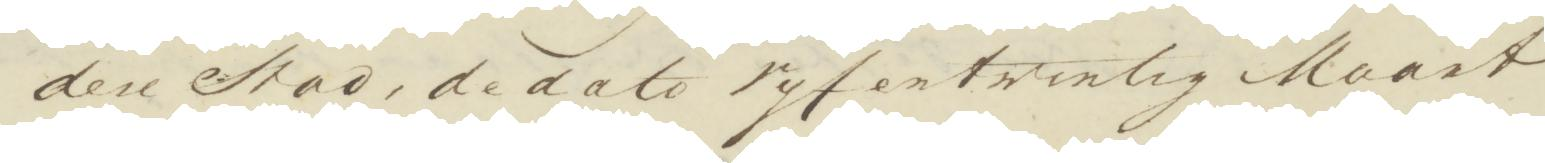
dese Stad, de dato vyf en twintig Maart
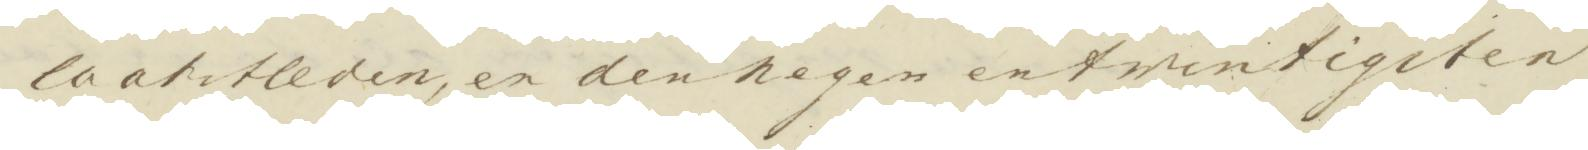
laatstleden, en den negen en twintigsten
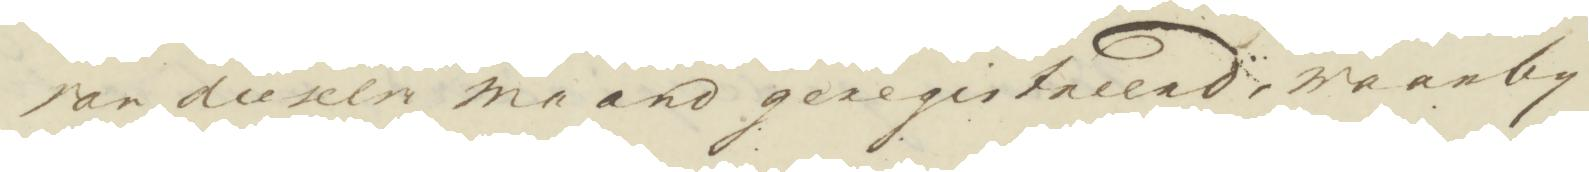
van deeselve maand geregistreerd, waarby
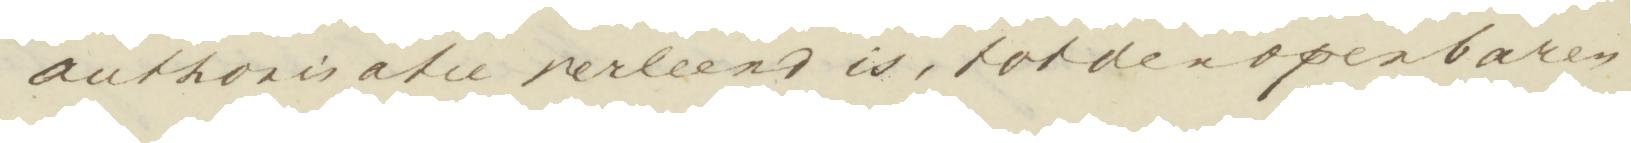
authorisatie verleend is, tot den openbaren
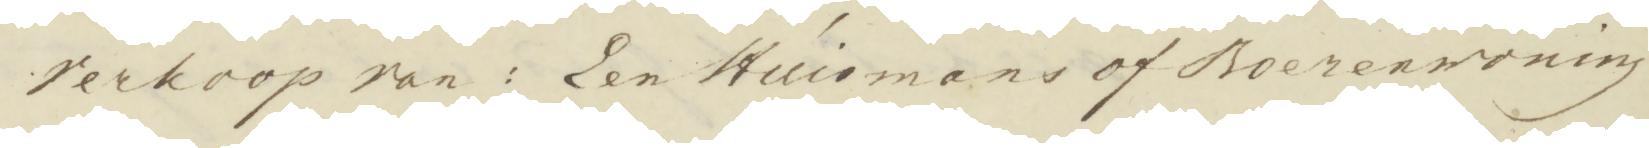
verkoop van: Een Huismans of Boerenwoning
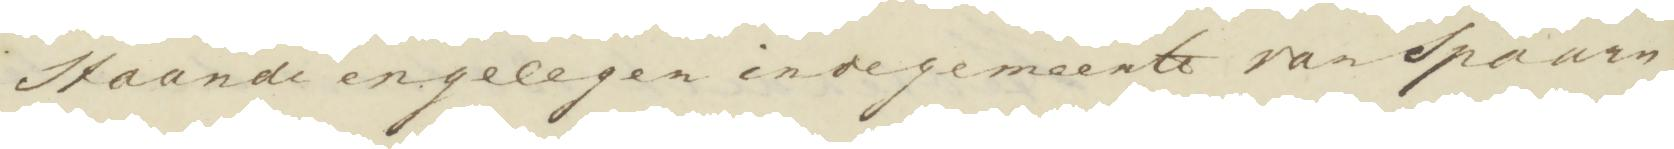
staande en gelegen in de gemeente van Spaarn
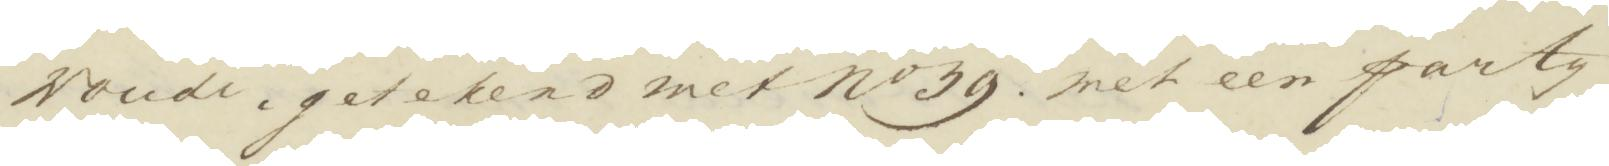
woude, getekend met n=o 39. met een party
